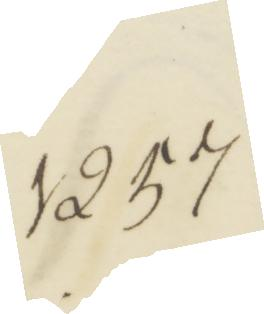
1257
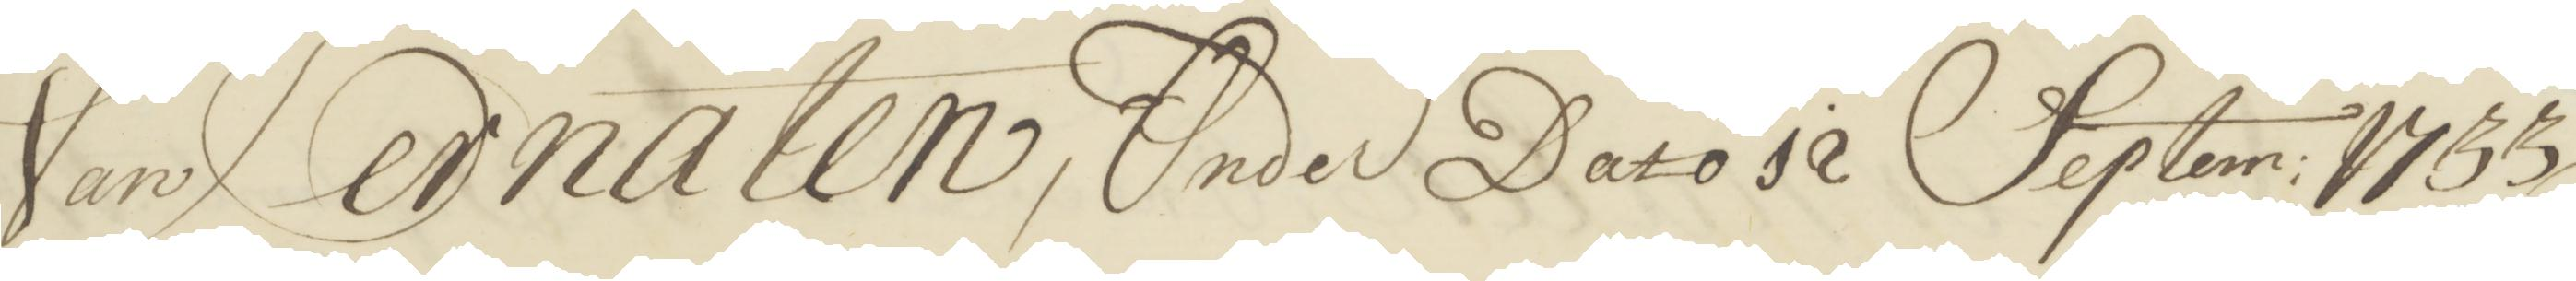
Van Ternaten, Onder Dato 12 Septem: 1733
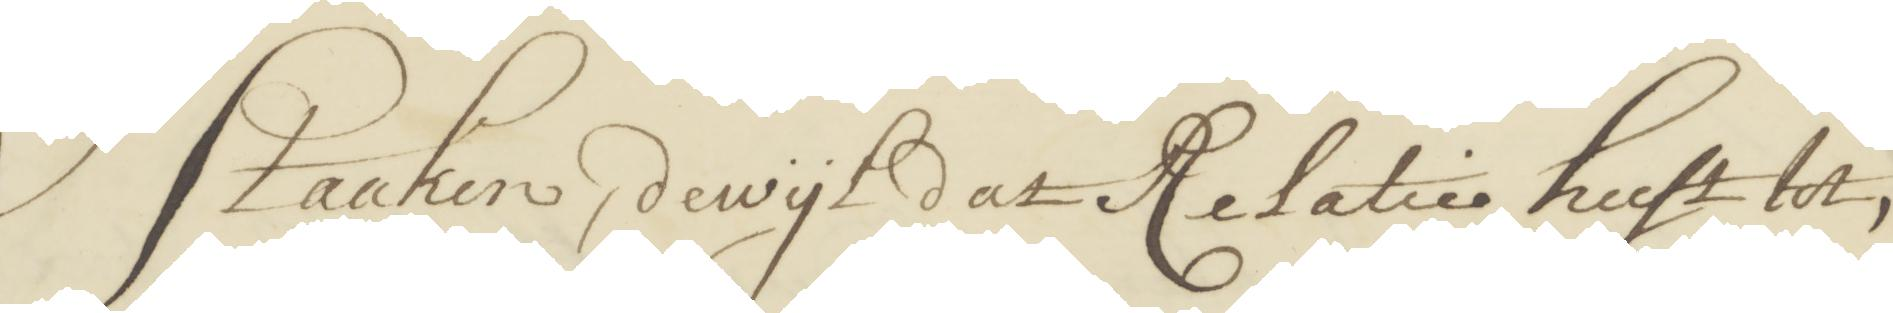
Staaken, dewijl dat Relativ heeft tot
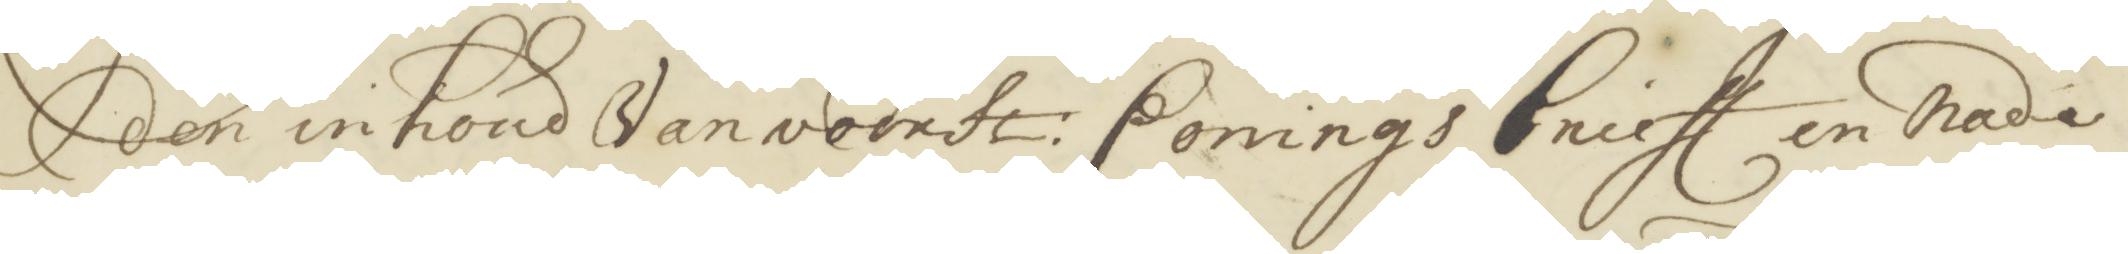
den inhoud van voorst: Conings brieff en nade
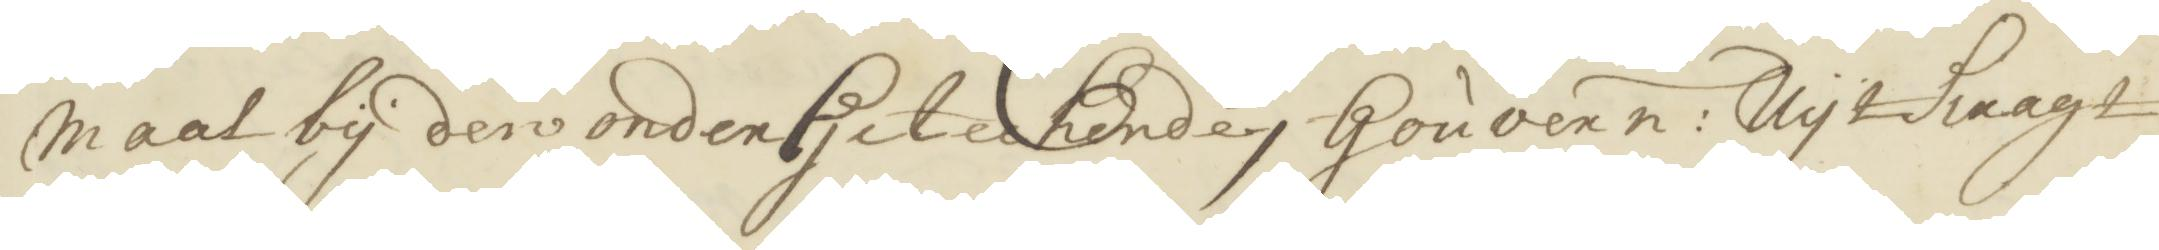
maal bij den onder Getekende, Gouvern: uijt kragt
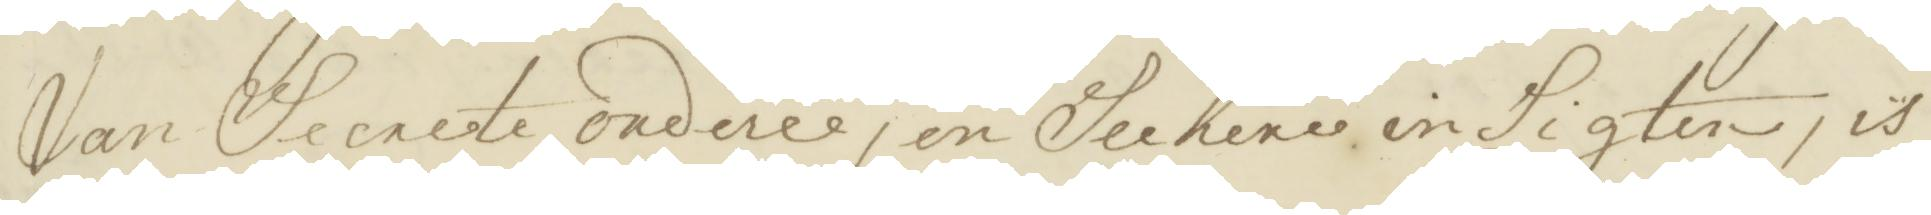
Van Secrete orders, en Seekere in Sigten, is
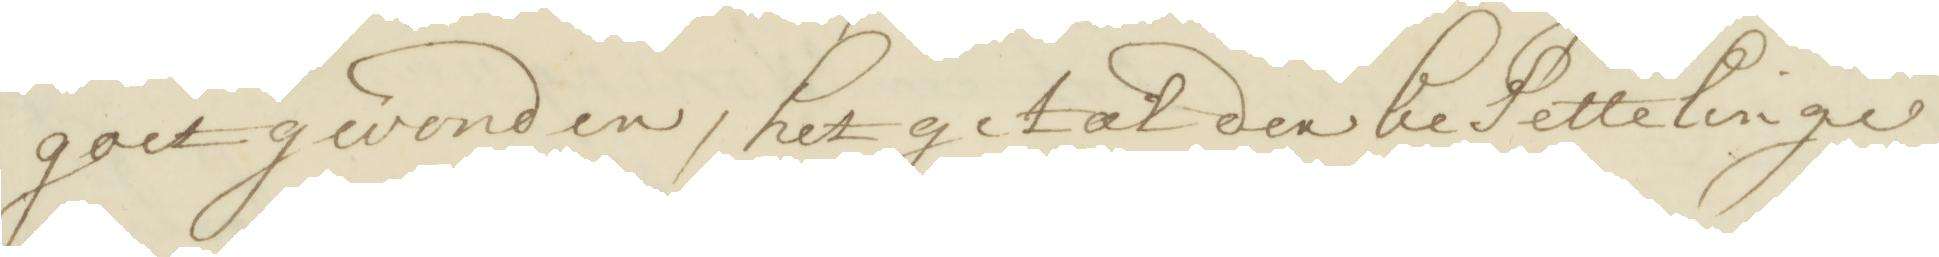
goet gevonden, het getal der besettelinge
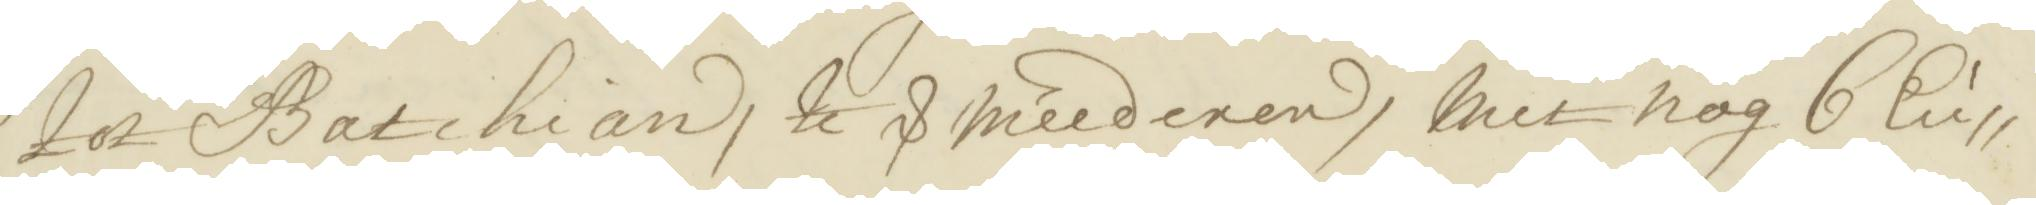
tot Batchian, te vermeederen, met nog 6 Eu„
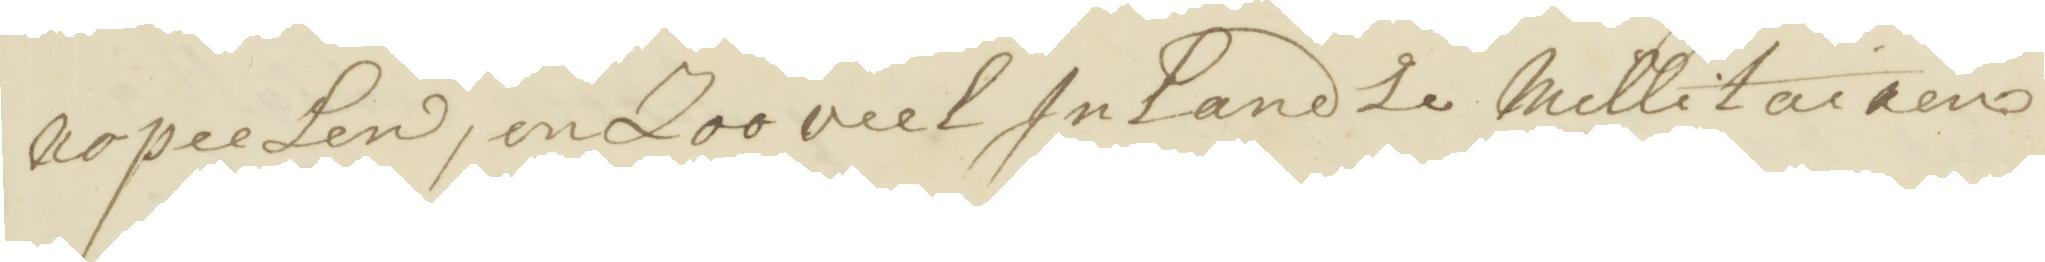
ropeesen, en zoo veel jnlandse millitairen
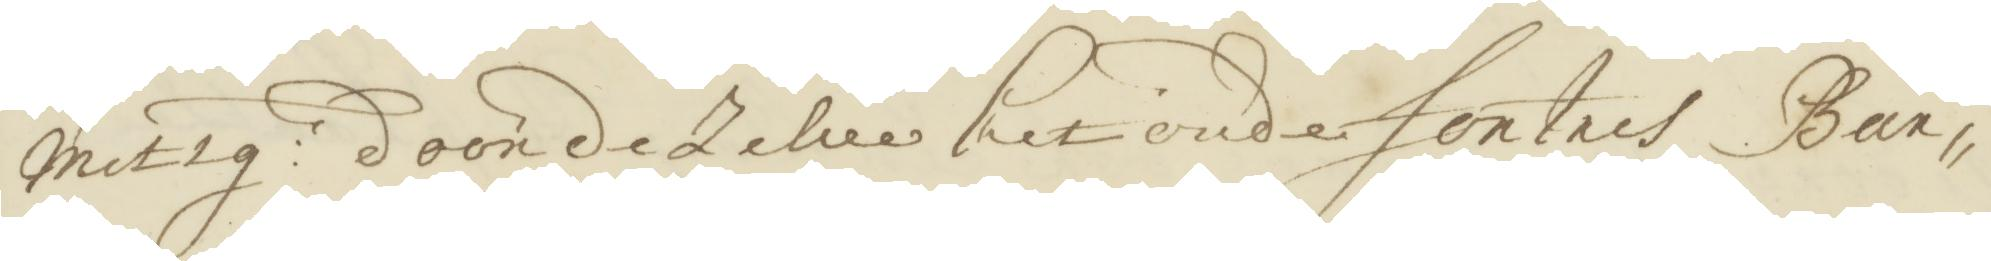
mittg:s door de zelve het oude fortres Bar„
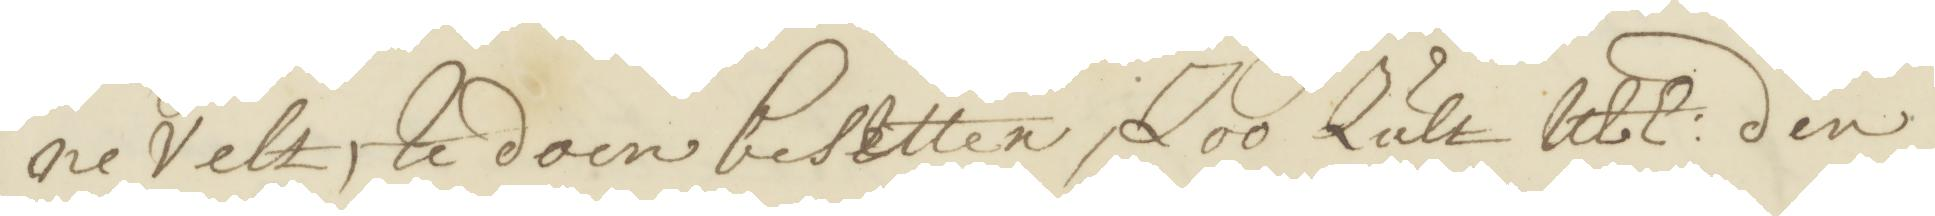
ne Velt, te doen besetten, zoo zult uEE: den
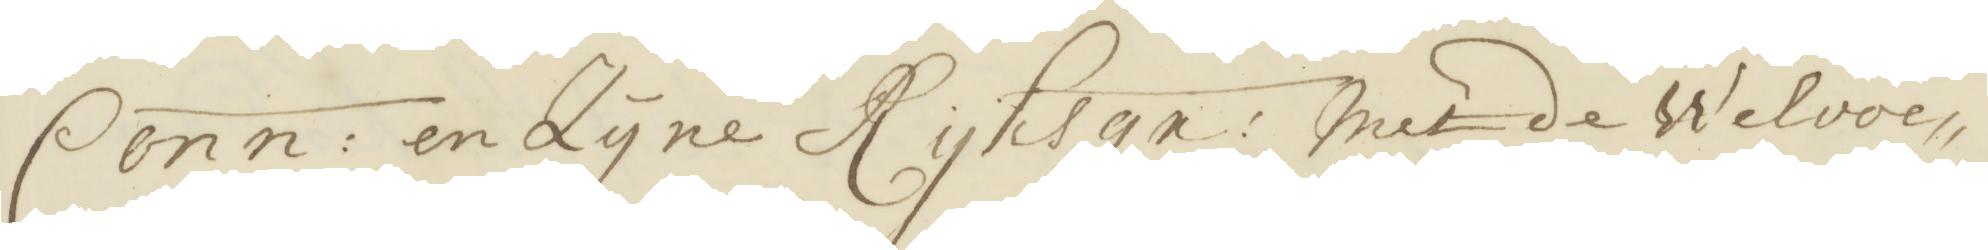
Conn: en zijne Rijksgr: met de Welvoe„
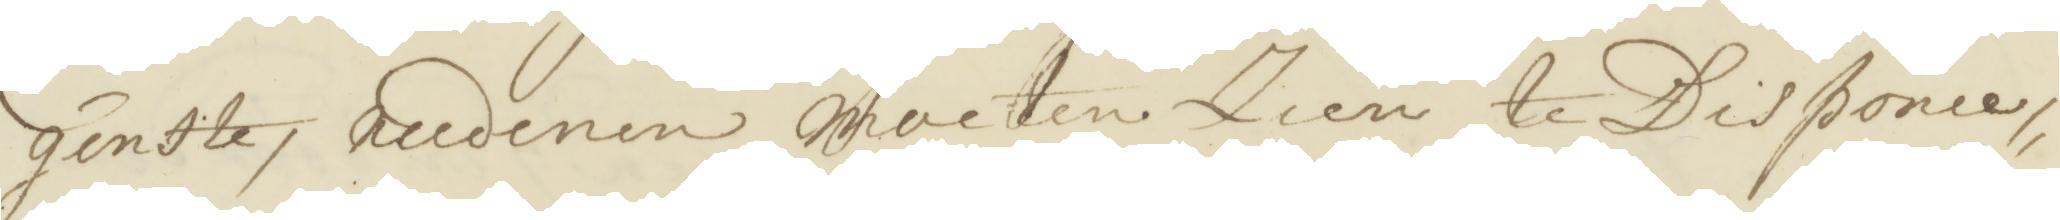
genste, reedenen moeten zien te Disponie„
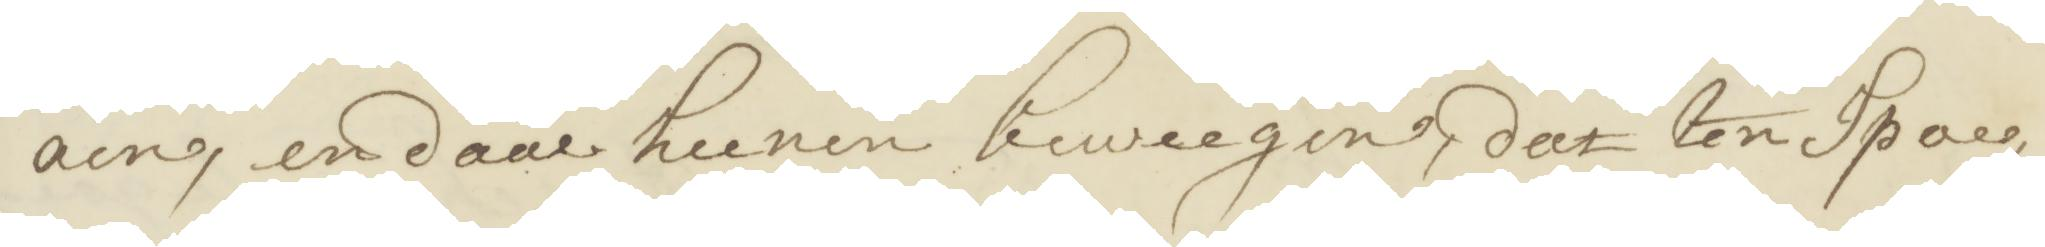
ren, en daar heenen beweegen, dat ten spoe„
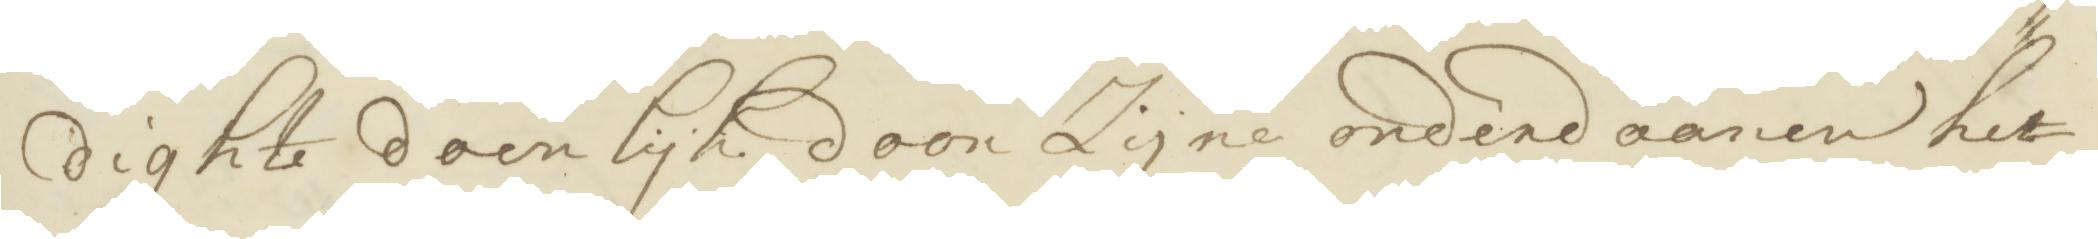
digh te doenlijk door zijne onderdaanen het
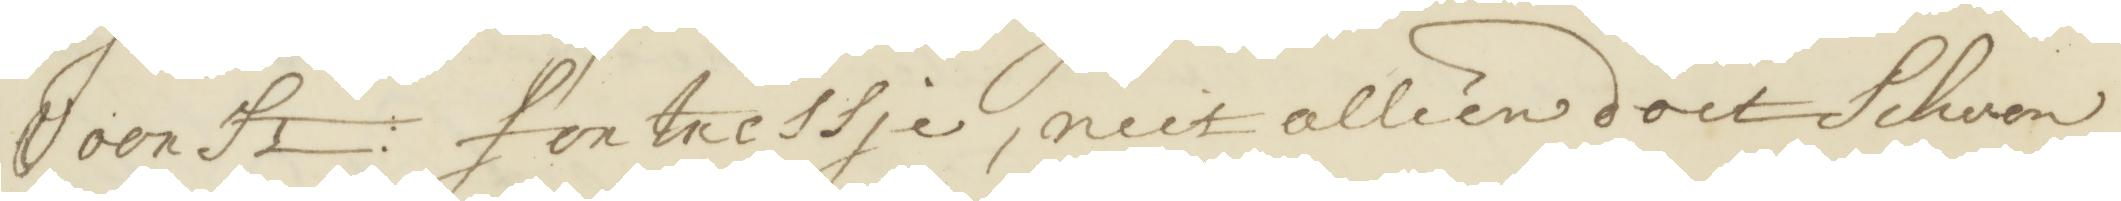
Voorst: fortressje, niet alleen doet schoon
